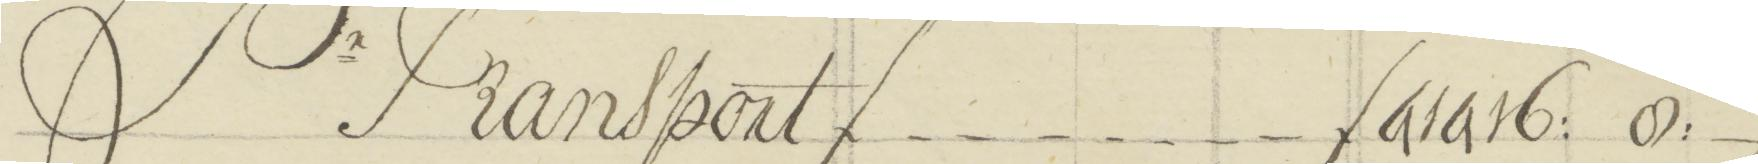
P=r Transport ƒ - - - - - - - ƒ 41416: 8: —
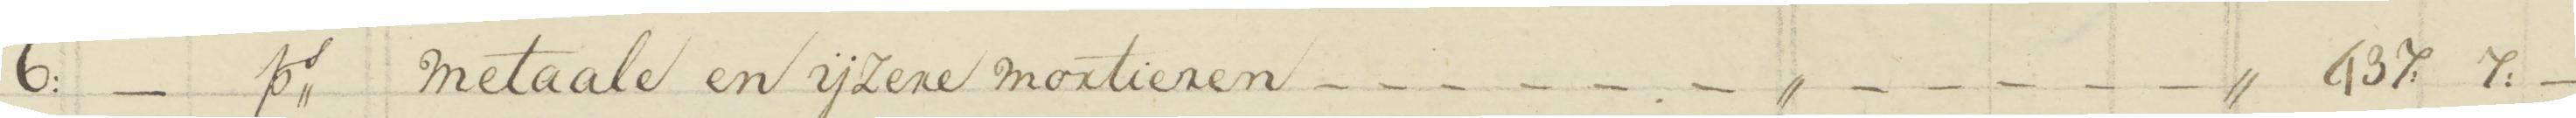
6: — p„s metaale en ijzere mortieren - - - - - - „ - - - - - 437: 7: —
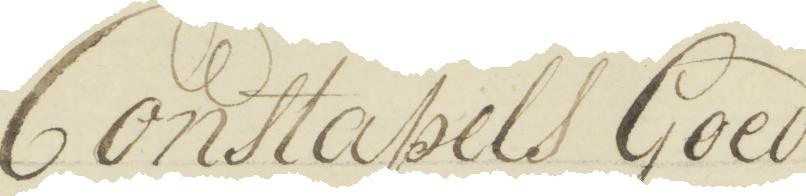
Constapels Goed
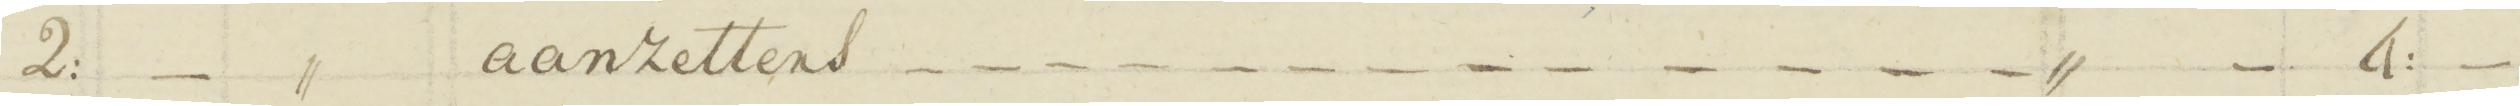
2: — „ aanzetters - - - - - - - - - - - - - „ - 4: —
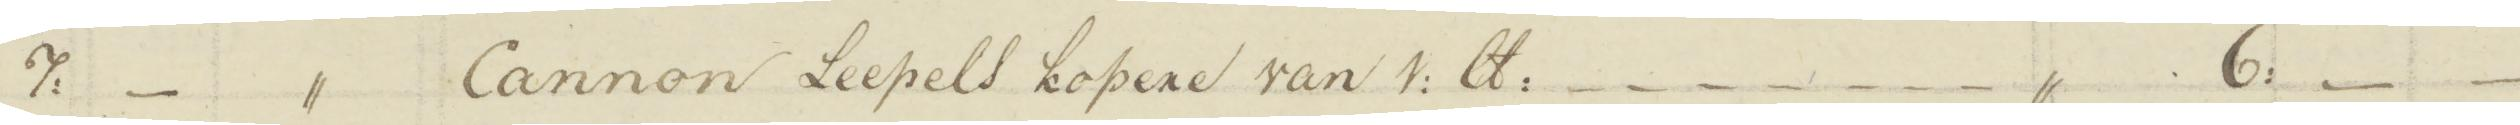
7: — „ Cannon Leepels kopere van 1: lb: - - - - - „ 6: — —
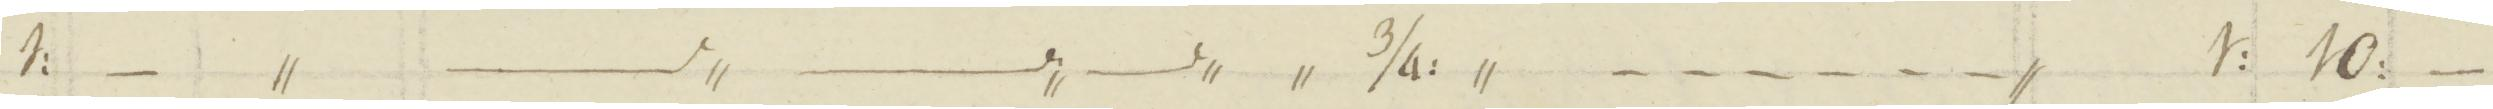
1: — „ _„o _„o _„o „ ¾: „ - - - - - - „ 1: 10: —
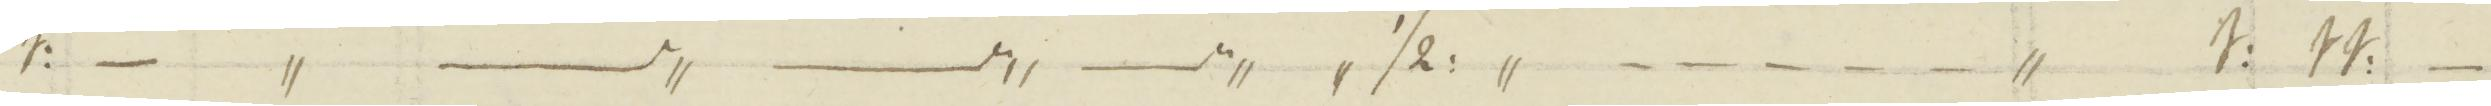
1: — „ _„o _„o _„o „ ½: „ - - - - - „ 1: 11: —
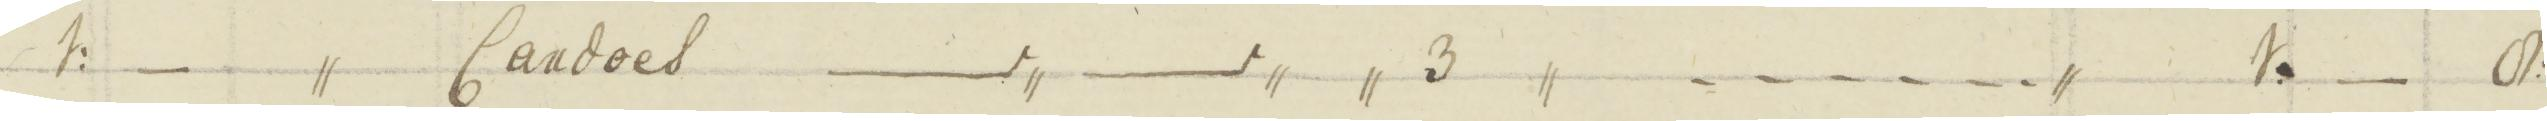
1: - „ Cardoes _„o _„o „ 3 „ - - - - - - 1: — 8:
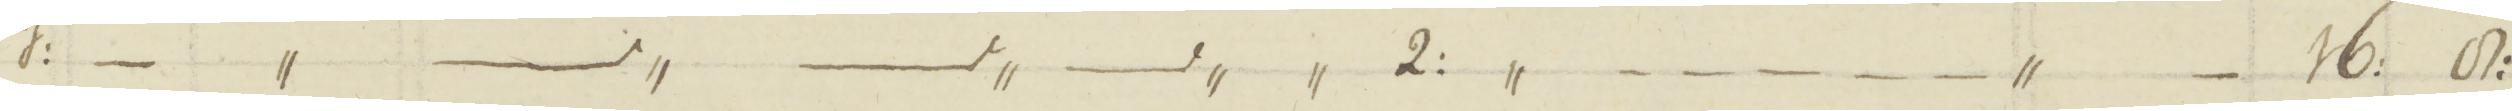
1: — „ _„o _„o _„o „ 2: „ - - - - - „ - 16: 8:
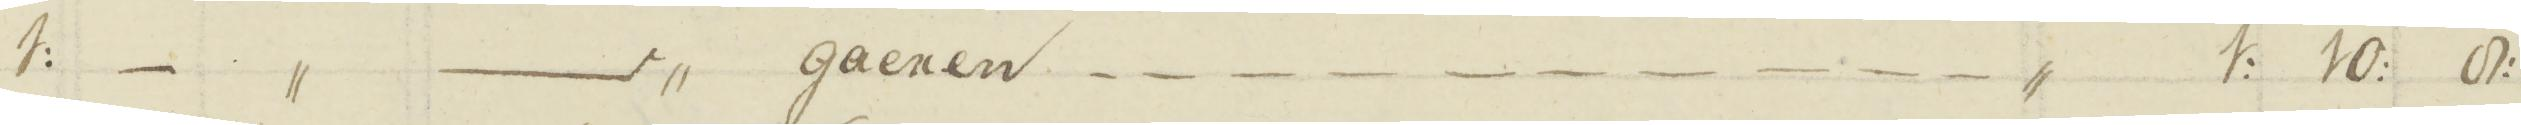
1: — „ _„o gaeren - - - - - - - - - - „ 1: 10: 8:
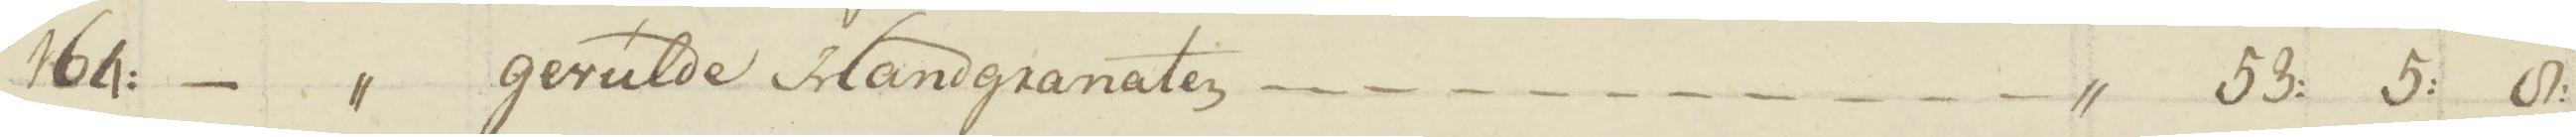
164: — „ gevulde Handgranaten - - - - - - - - - - - „ 53: 5: 8:
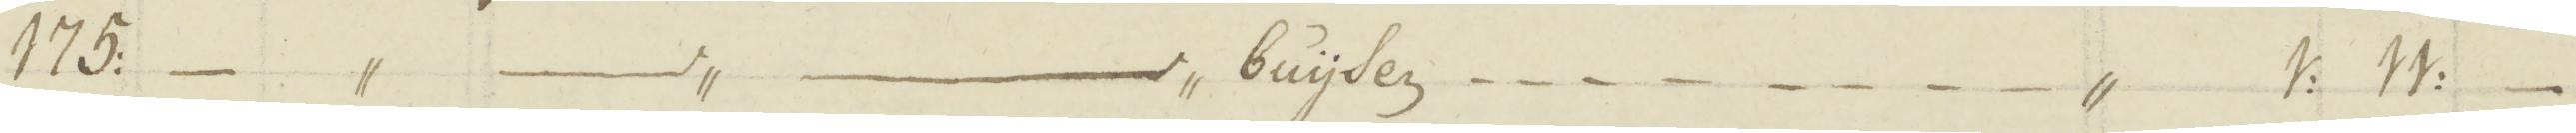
175: — „ _„o _:o „ buijsen - - - - - - - - „ 1: 11: —
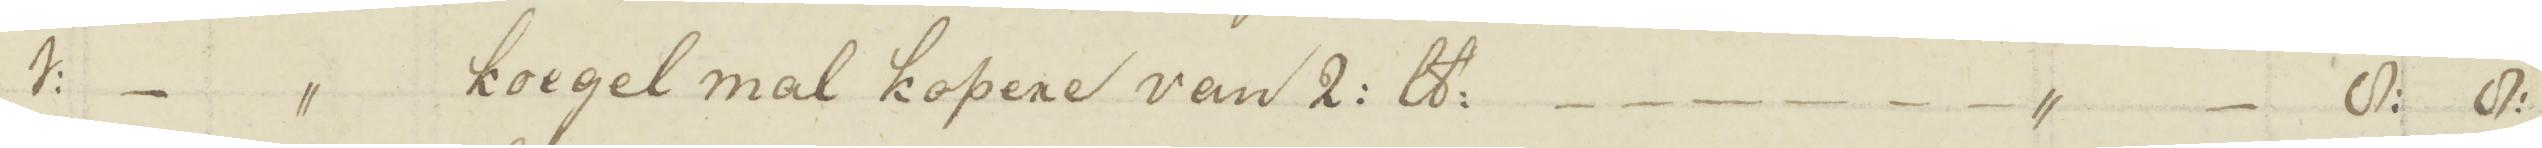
1: — „ koegel mal kopere van 2: lb: - - - - - - „ — 8: 8:
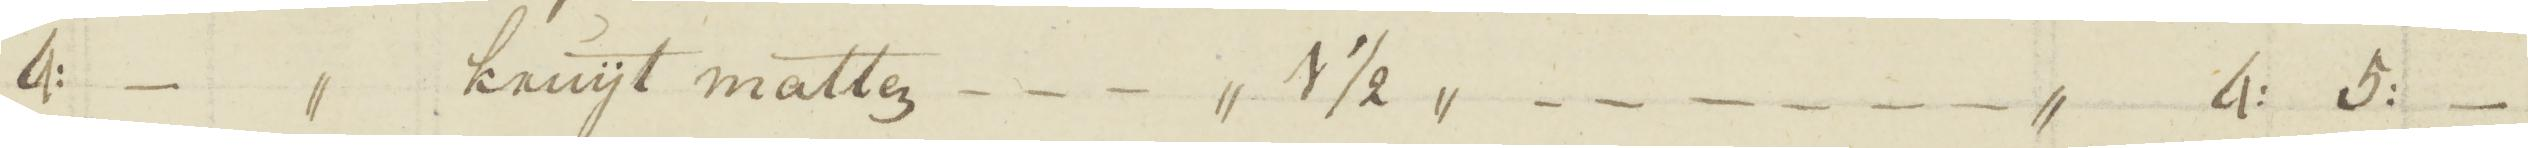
4: — „ kruijt matten - - - „ 1½ „ - - - - - - „ 4: 5: —
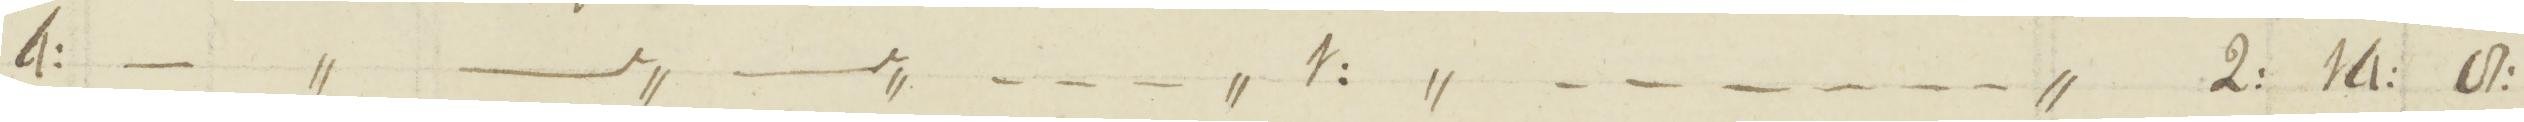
4: — „ _„o _„o - - - „ 1: „ - - - - - - „ 2: 14: 8:
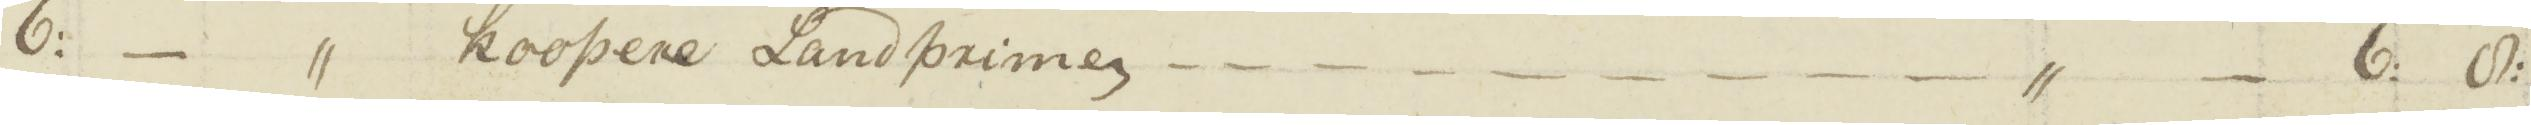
6: — „ koopere Landprimen .... „ - 6: 8:
